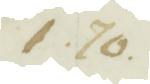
1.70.
